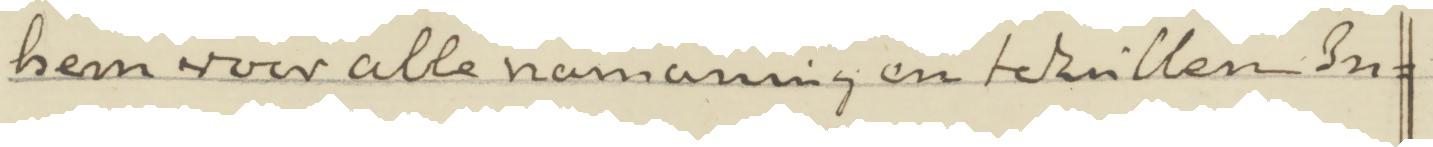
hem voor alle namaningen te zullen In=
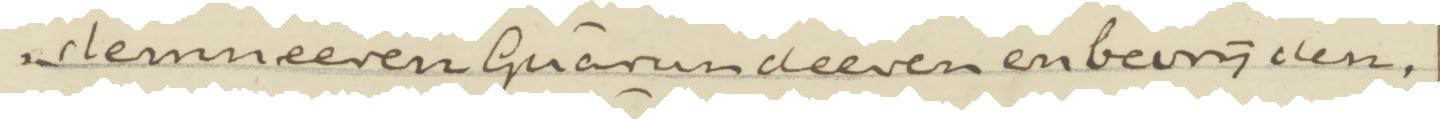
-demneeren guarandeeren en bevrijden,
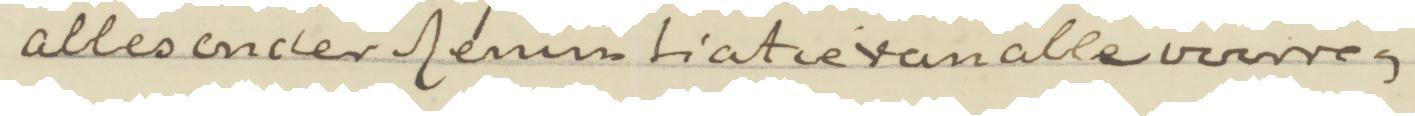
alles onder Renuntiatie van alle voorreg
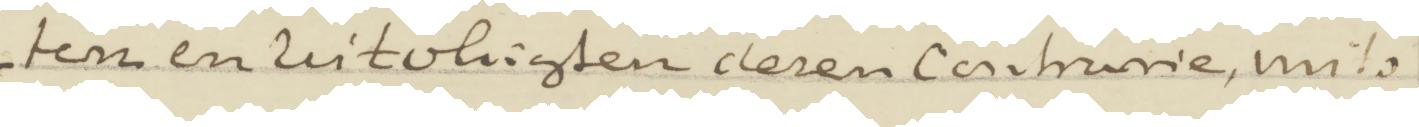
-ten en uitvlugten dezen Contrarie, mits
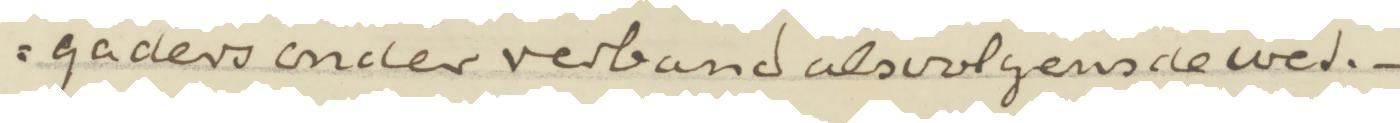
=gaders onder verband als volgens de wet.
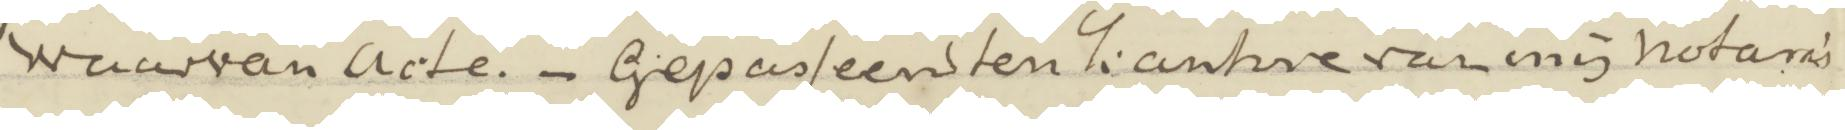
Waarvan Acte - Gepasseerd ten kantore van mij Notaris
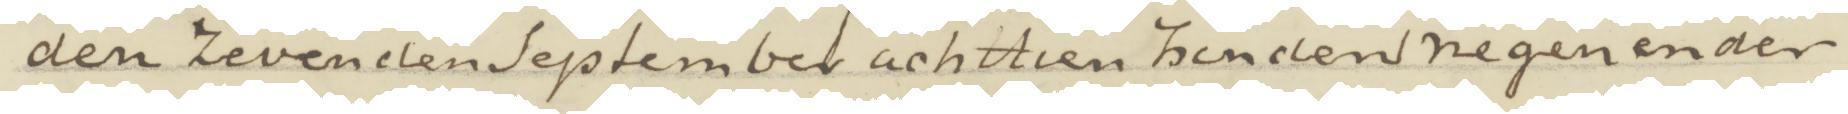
den Zevenden September achttien honderd negen en der
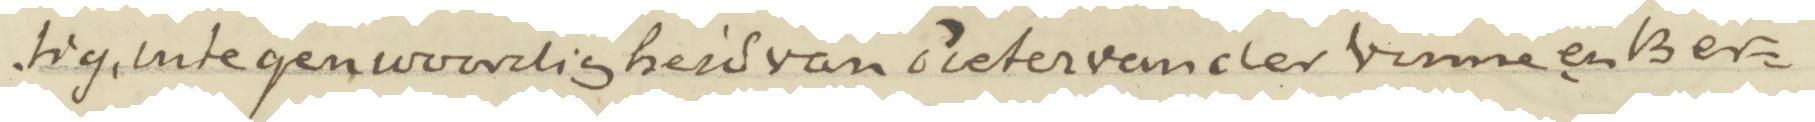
-tig, in tegenwoordigheid van Pieter van der Vinne en Ber=
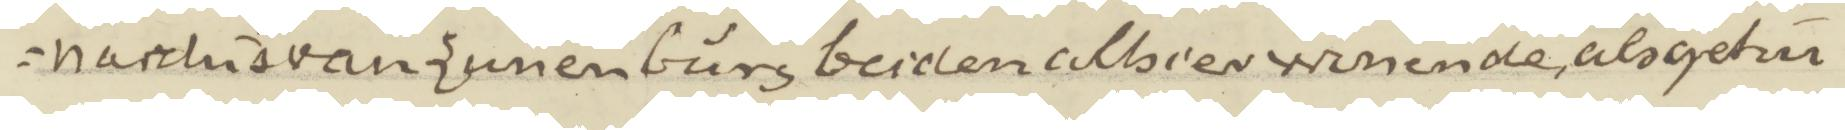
=nardus van Lunenburg beiden alhier wonende, als getui
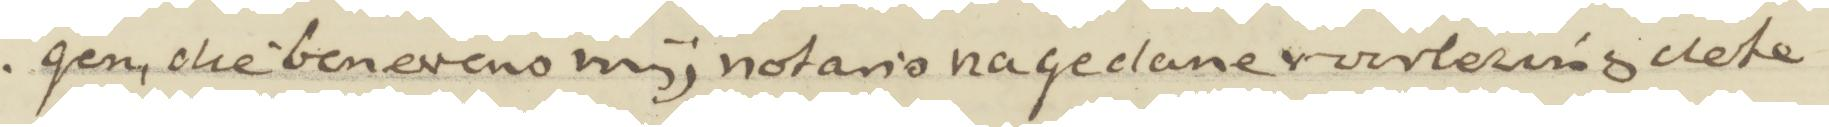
.gen, die benevens mij notaris na gedane voorlezing de te
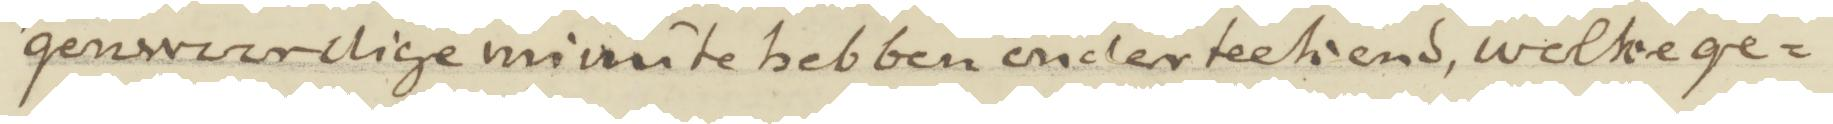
genwoordige minute hebben onderteekend, welke ge=
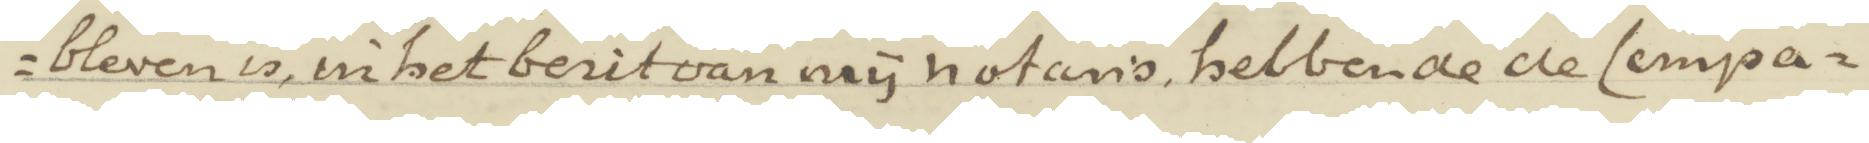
=bleven is, en het bezit van mij notaris, hebbende de Compa=
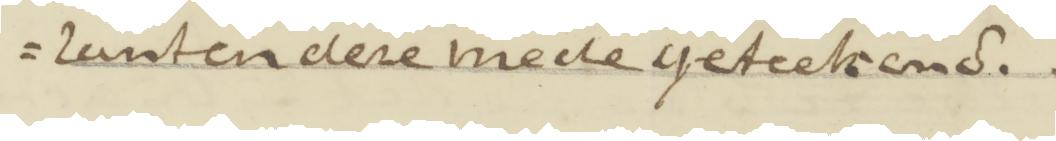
=ranten deze mede geteekend.
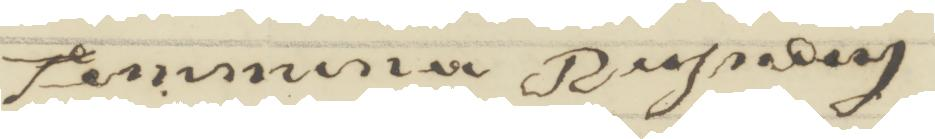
Femmina Reijnders
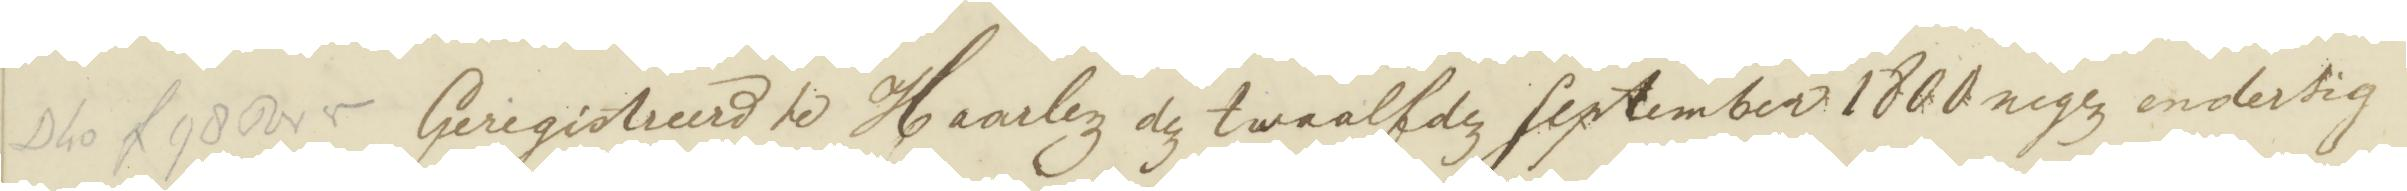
D40 f 98 R v 5 Geregistreerd te Haarlem den twaalfden September 1800 negen en dertig
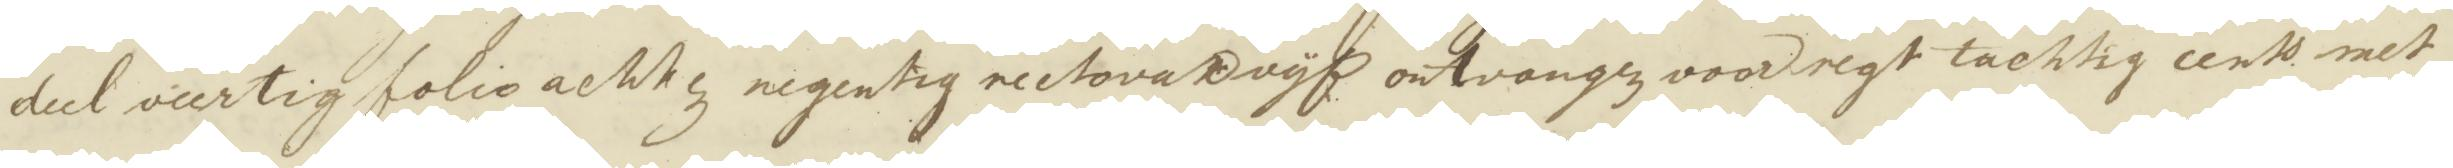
deel veertig folio acht en negentig recto vak vijf ontvangen voor regt tachtig cents met
